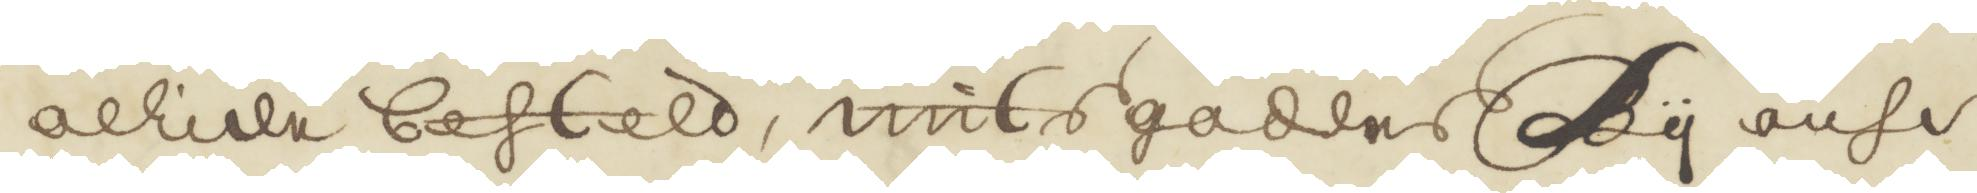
alhier besteld, mitsgaders Bij onse
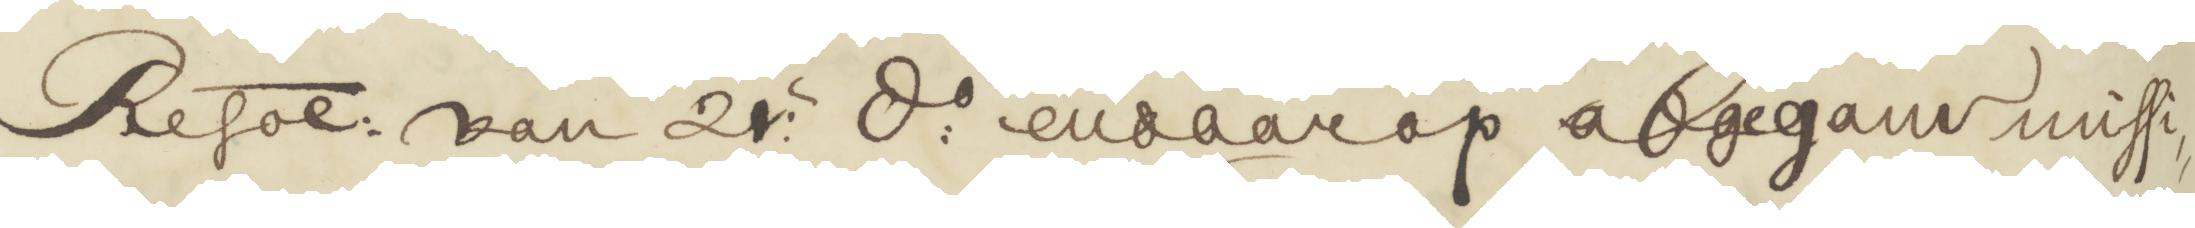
Resol: van 21:' d:o en daarop afgegane missi„
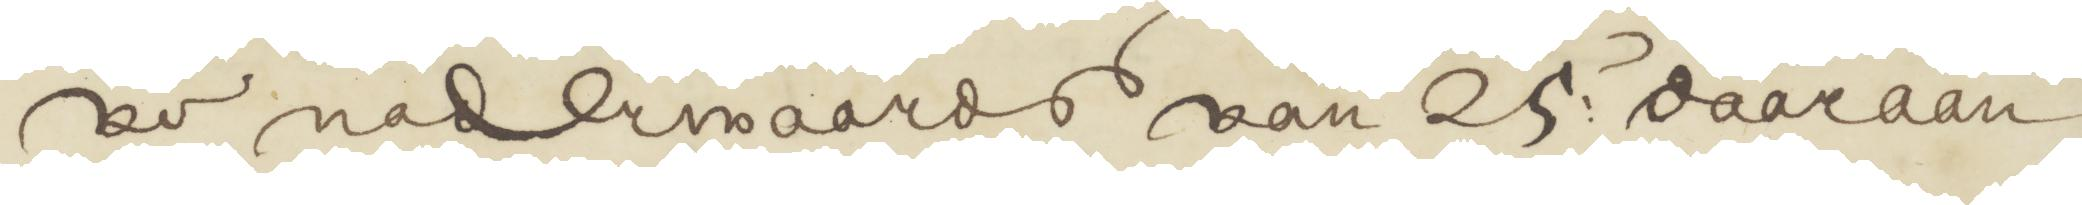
ve naderwaards van 25:' daaraan
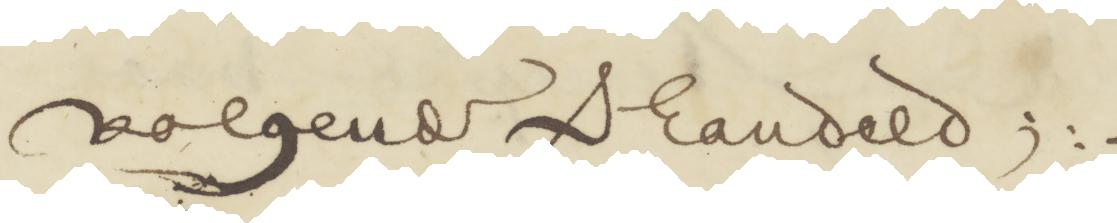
volgende verhandeld ;:
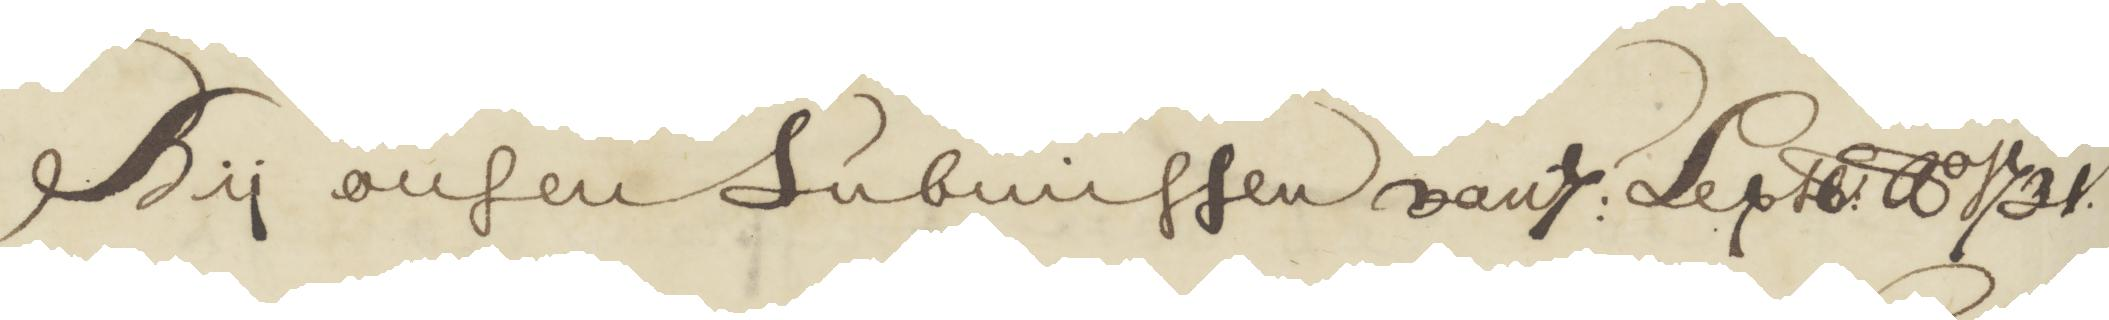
Bij onsen submissen van 7:' Septb: Ao 1731.
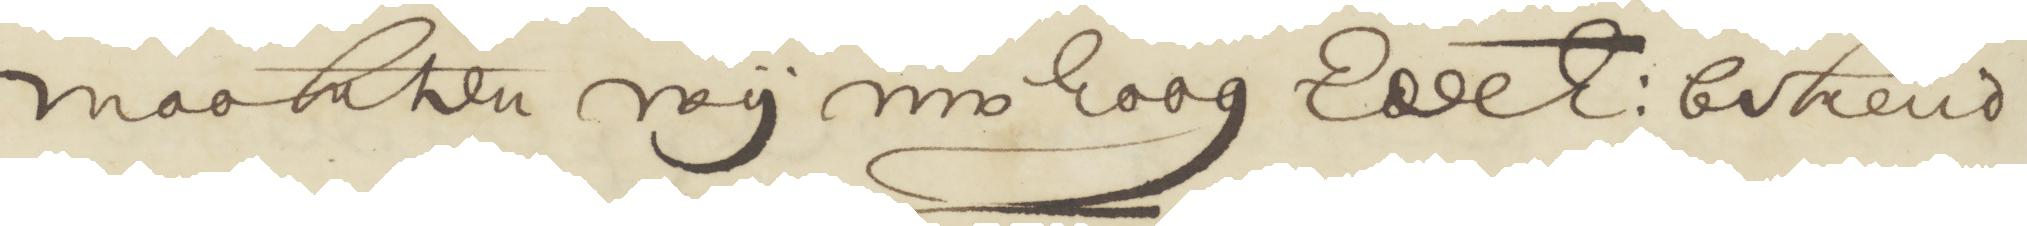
maakten wij uw hoog Edelh: bekend
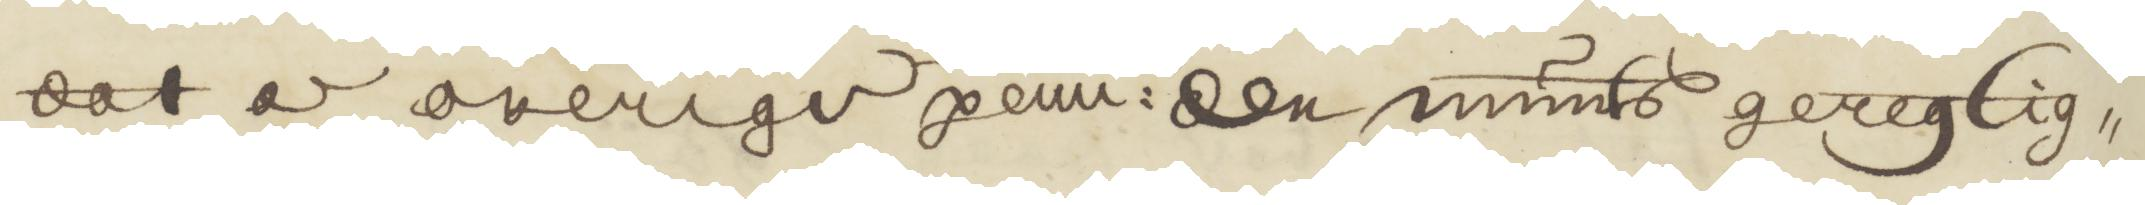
dat de overige penn: der munts geregtig„
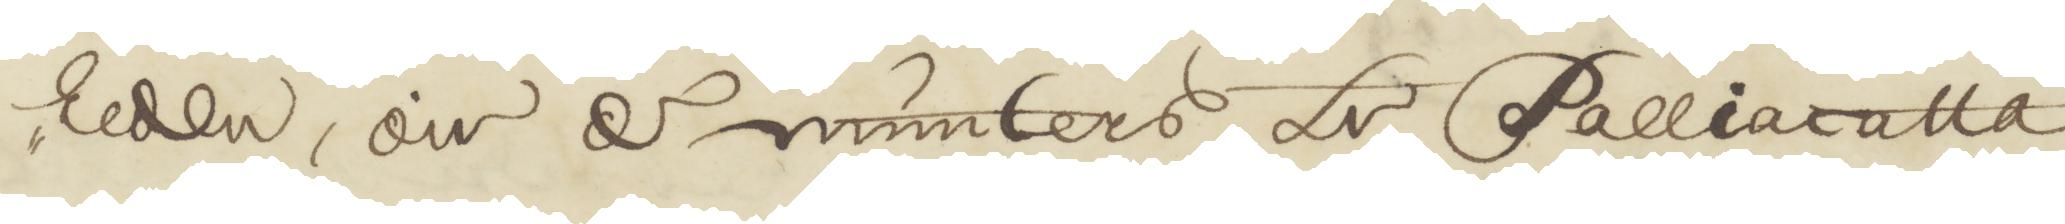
„heden, die de munters te Palliacatta
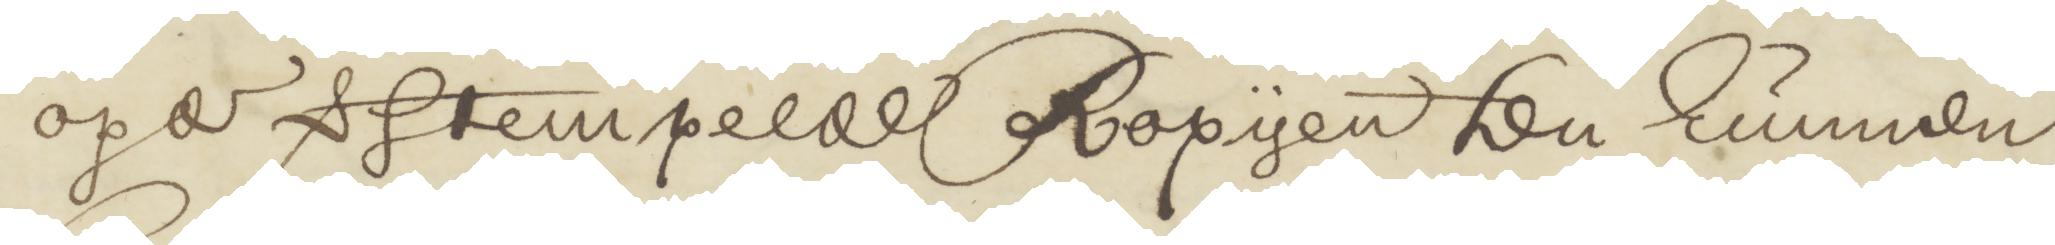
op de verstempelde Ropijen ten hunnen
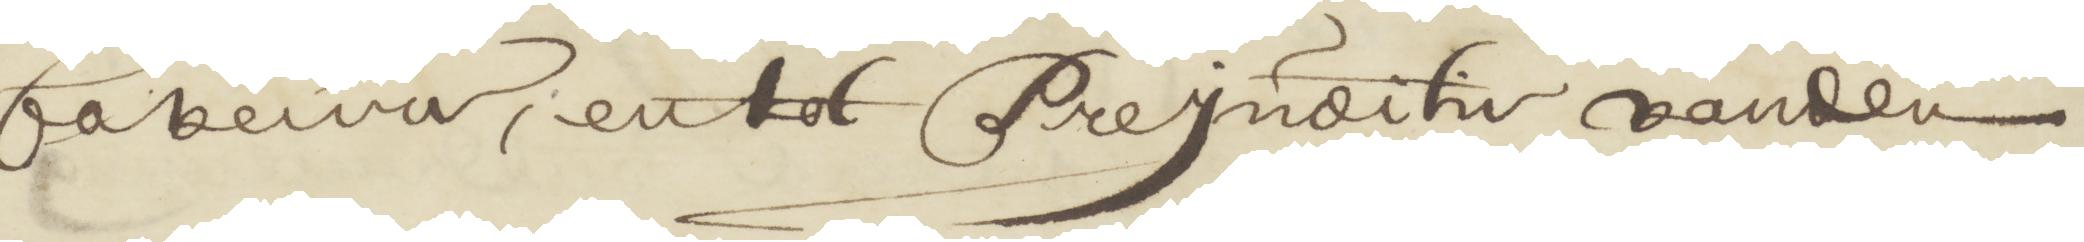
faveure, en tot Prejuditie van den
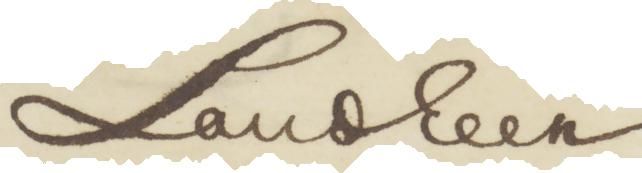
Landheer
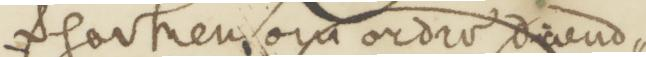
versoeken om ordre diend„
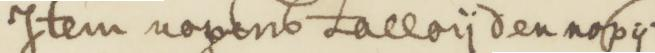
Item nopens 't alloij der ropijen
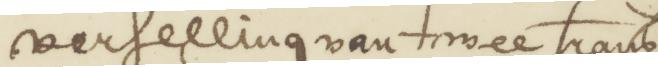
verselling van twee trans
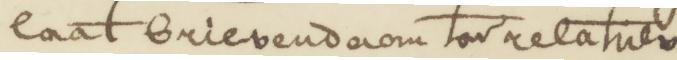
laat brieven daar toe relatiev
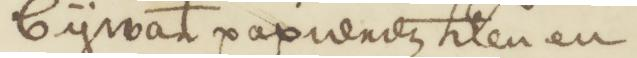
bij wat papieren 't Een en
